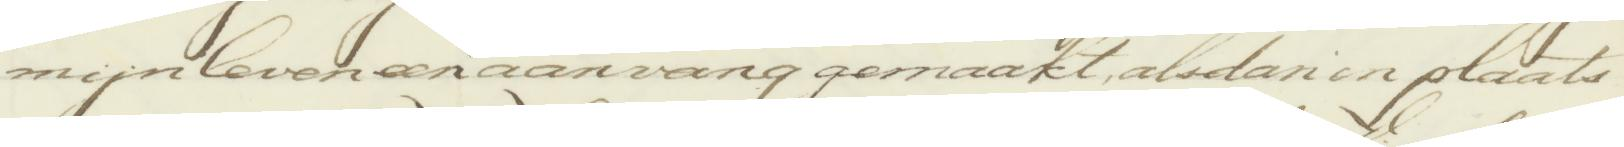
mijn leven een aanvang gemaakt, alsdan in plaats
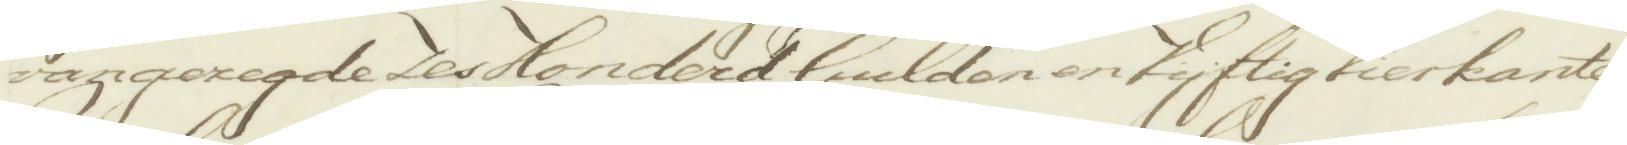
van gezegde Zes Honderd Gulden en Vijftig Vierkante
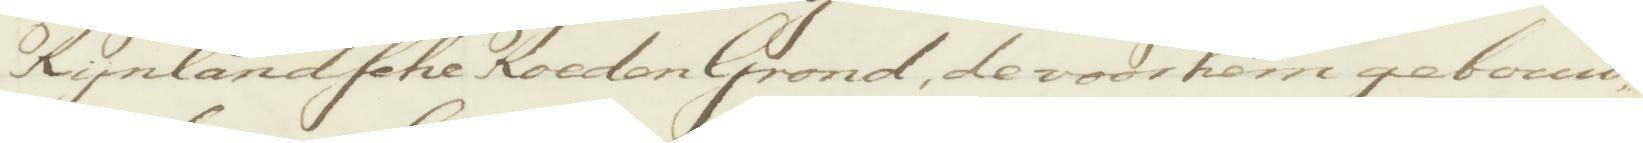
Rijnlandsche Roeden Grond, de voor hem gebouw„
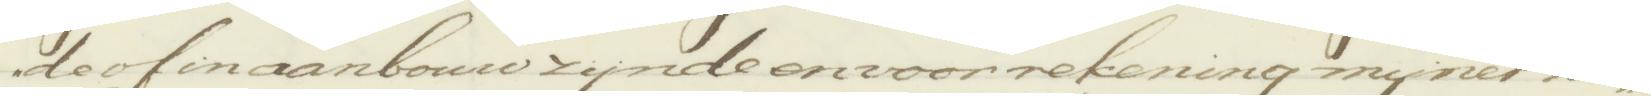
„de of in aanbouw zijnde en voor rekening mijner na„
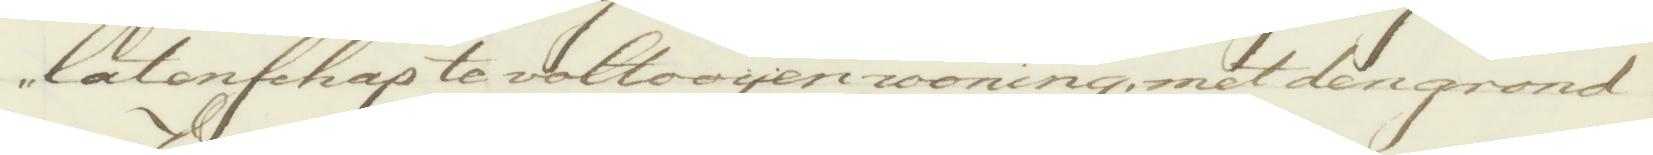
„latenschap te voltooijen woning, met den grond
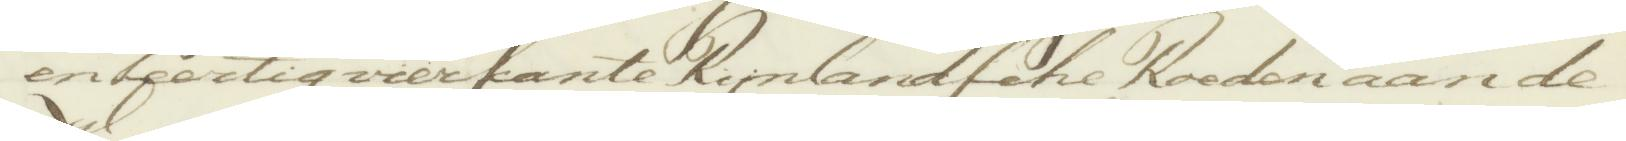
en Veertig vierkante Rijnlandsche Roeden aan de
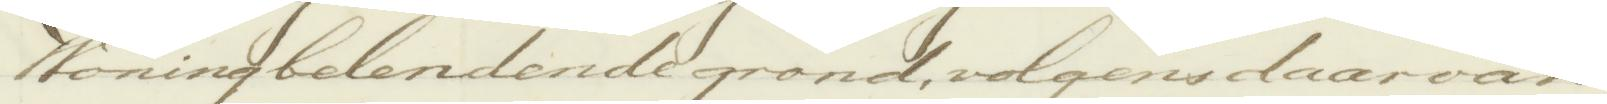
Woning belendende grond, volgens daarvan
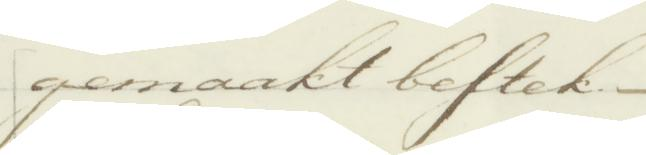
gemaakt bestek. —
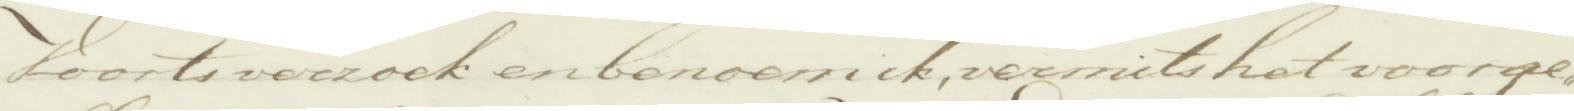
Voorts verzoek en benoem ik, vermits het voorge„
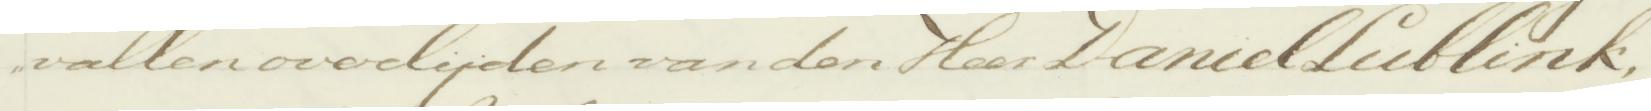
„vallen overlijden van den Heer Daniel Lublink,
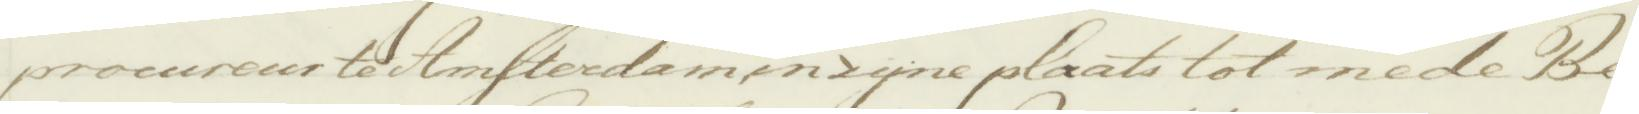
procureur te Amsterdam, in zijne plaats tot mede Be
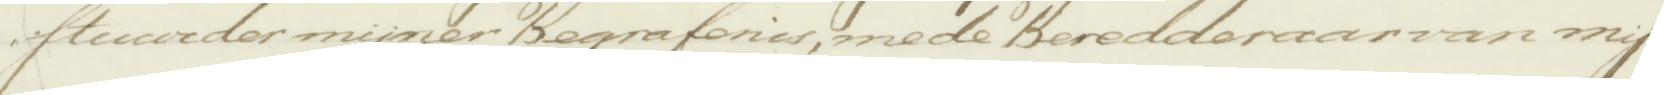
„stuurder mijner Begrafenis, mede Beredderaar van mij
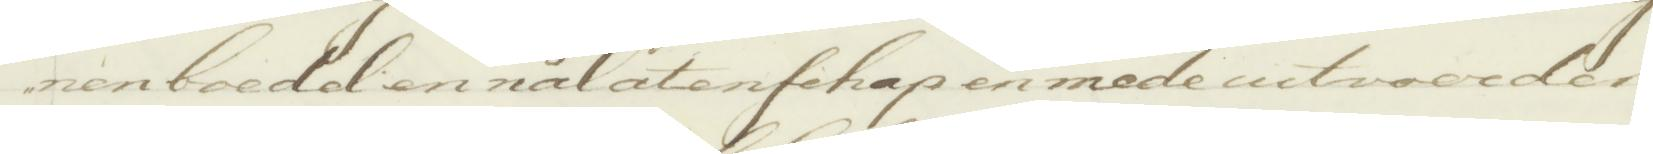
„nen boedel en nalatenschap en mede uitvoerder
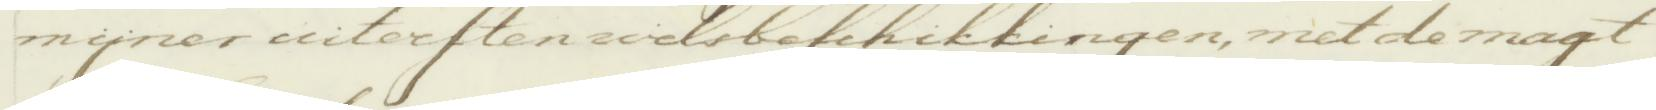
mijner uitersten wilsbeschikkingen, met de magt
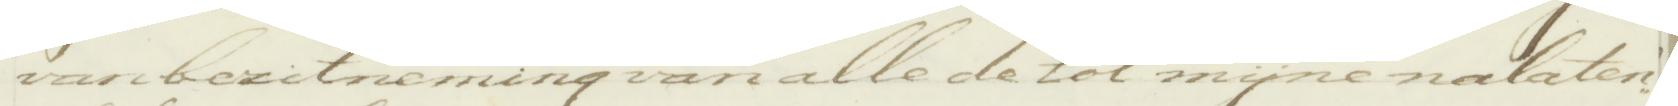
van bezitneming van alle de tot mijne nalaten„
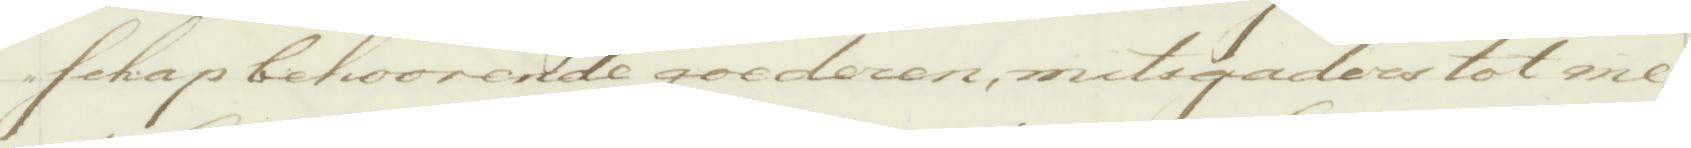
„schap behoorende goederen, mitsgaders tot me
